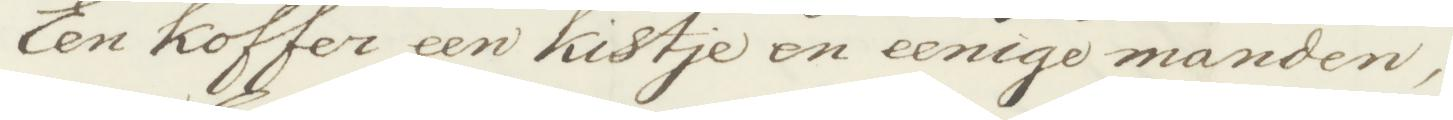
Een koffer, een kistje en eenige manden,
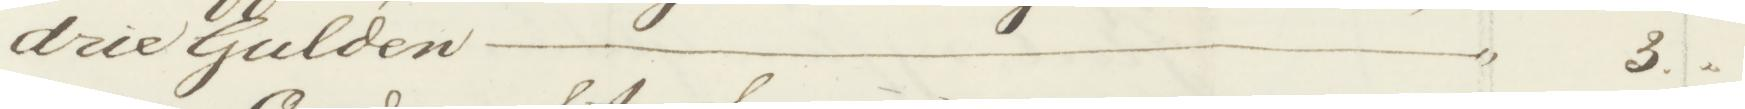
drie Gulden—„ 3.„
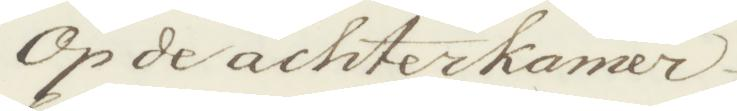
Op de achterkamer
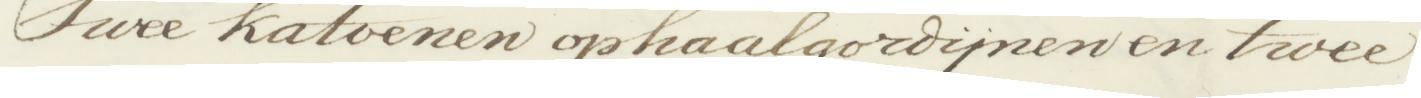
Twee katoenen ophaalgordijnen en twee
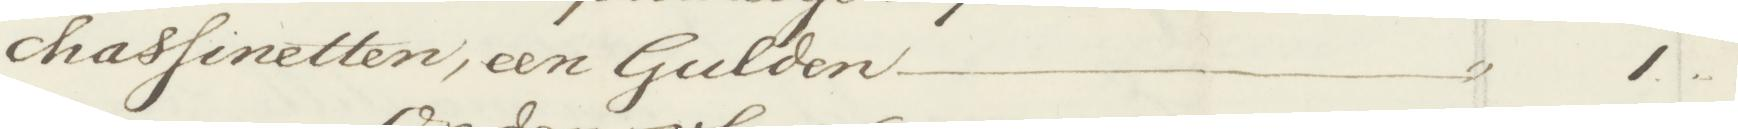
chassinetten, een Gulden—„ 1.„
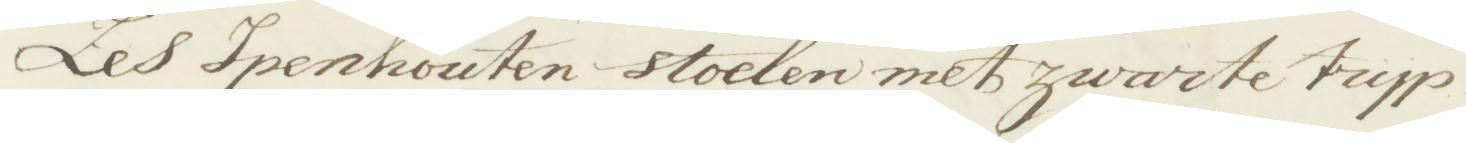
Zes Ipenhouten stoelen met zwarte trijp
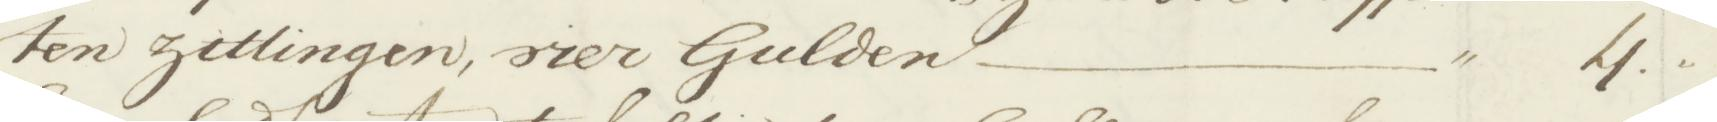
ten zittingen, vier Gulden —„ 4. „
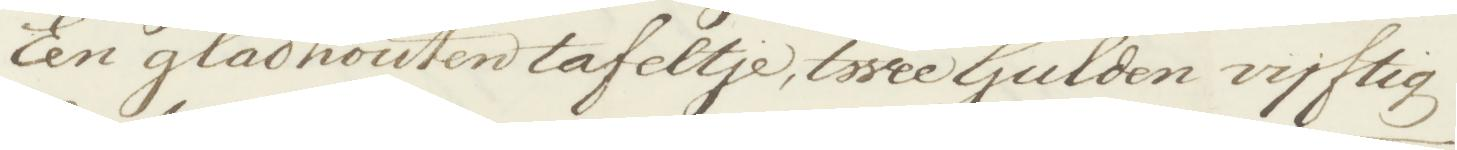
Een gladhouten tafeltje, twee Gulden vijftig
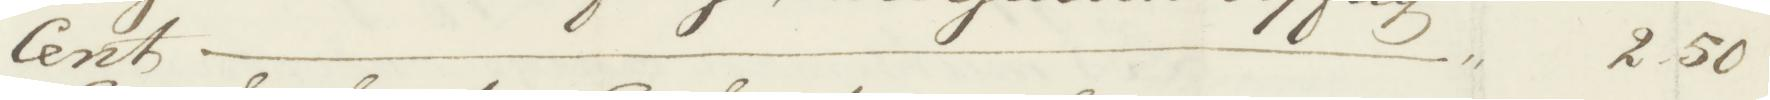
Cent —„ 2,50
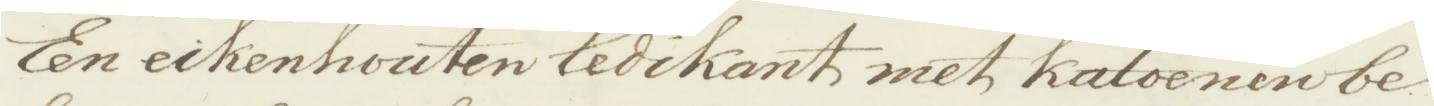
Een eikenhouten ledikant met katoenen be.
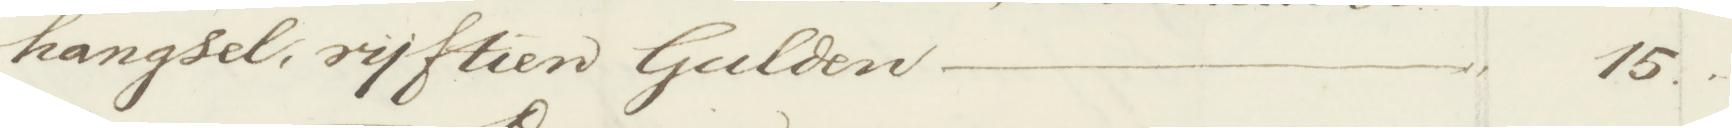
hangsel, vijftien Gulden—„ 15.„
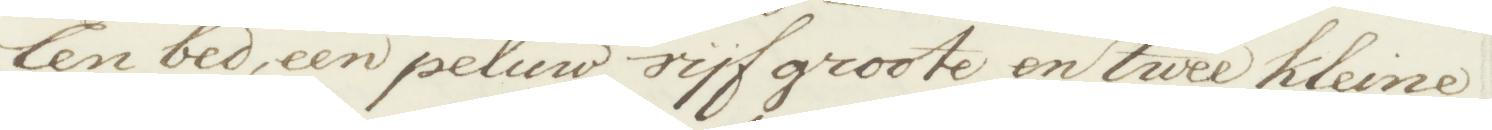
Een bed, een peluw, vijf groote en twee kleine
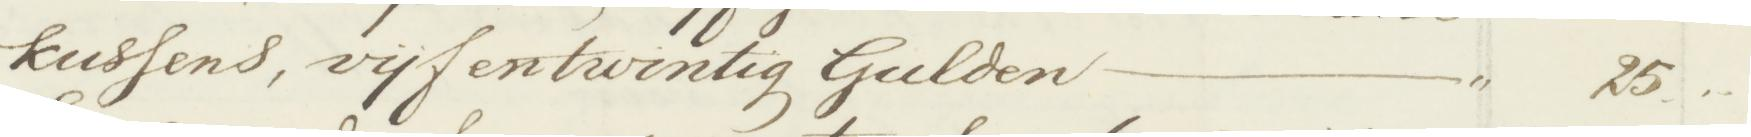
kussens, vijf en twintig Gulden—„ 25.„
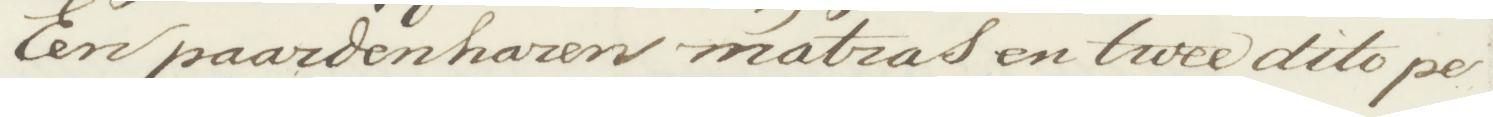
Een paardenharen matras en twee dito pe
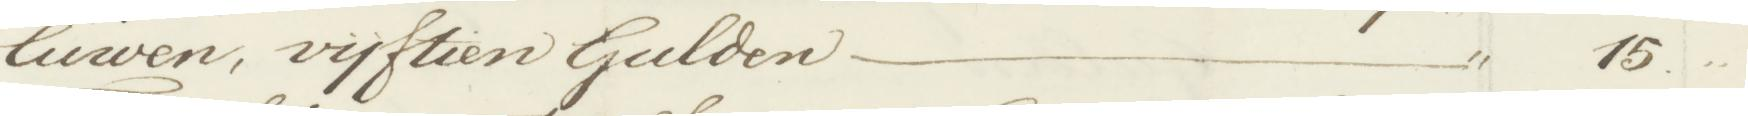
luwen, vijftien Gulden —„ 15.„
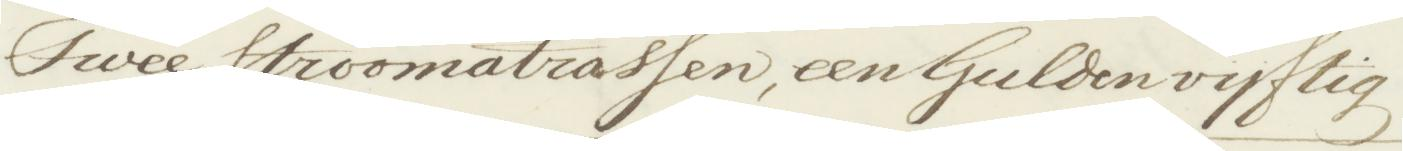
Twee stroomatrassen, een Gulden vijftig
